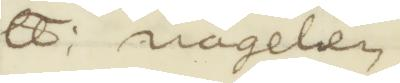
lb: nagelen
